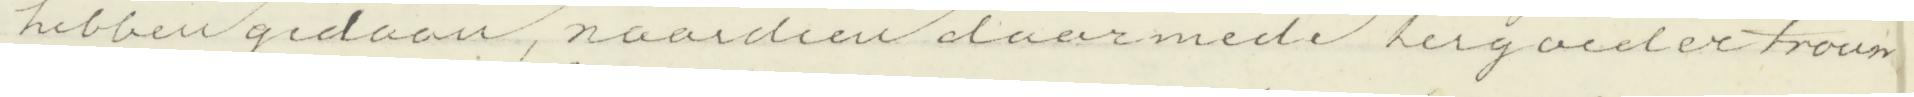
hebben gedaan, naardien daarmede ter goeder trouw
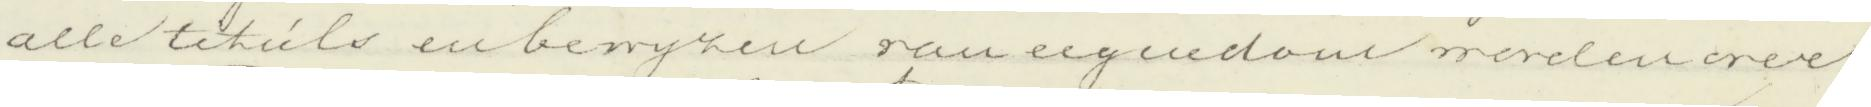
alle tituls enbewyzen van eigendom worden over
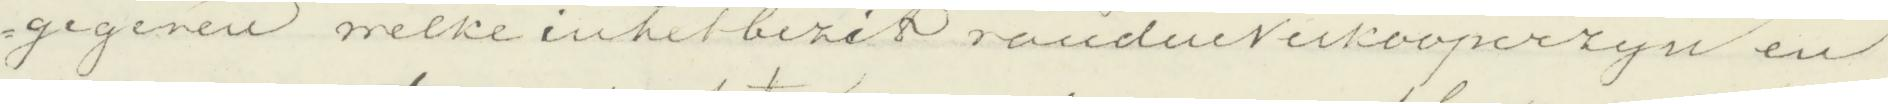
=gegeven welke inhet bezit vandenverkooperzyn en
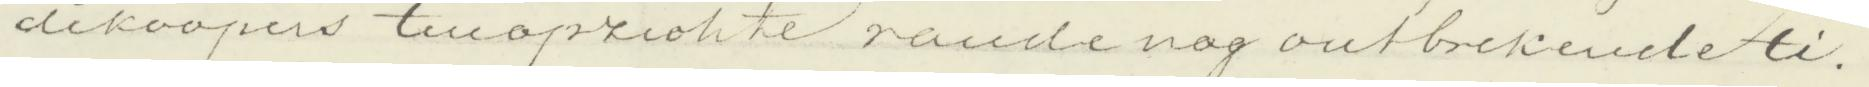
dekoopers ten opzichte vande nog ontbrekende ti„
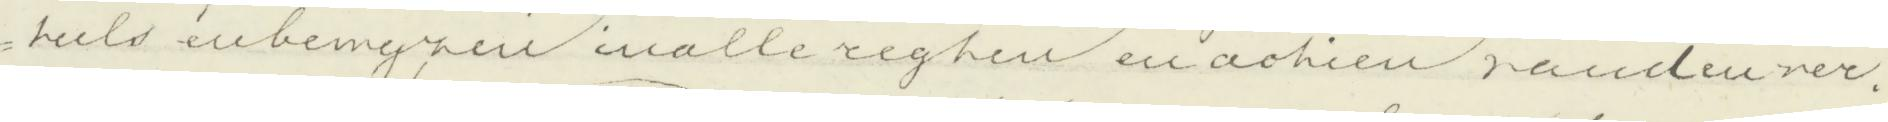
=tels enbewyzen inalle regten en actien vanden ver„
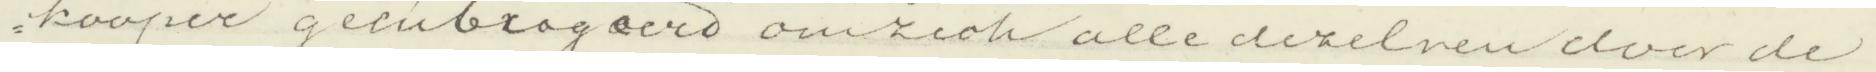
=kooper gesubrogeerd omzich alle dezelven door de
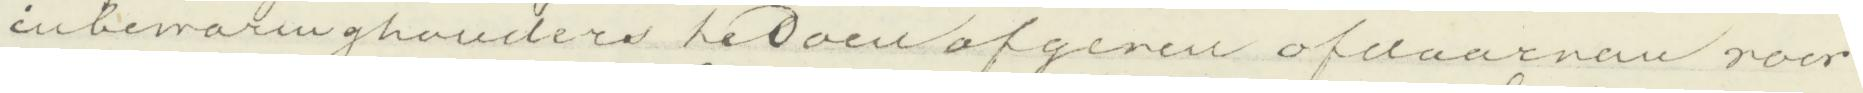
inbewaringhouders tedoen afgeven ofdaarvan voor
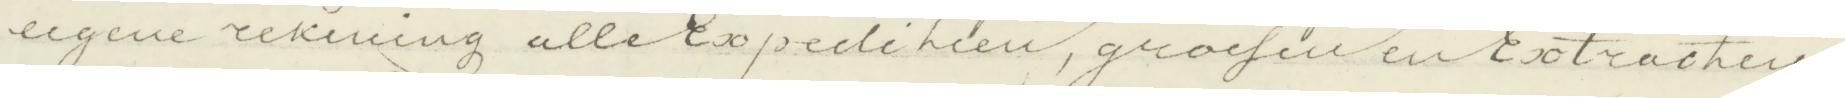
eigene rekening alleExpeditien, grossen enExtracten
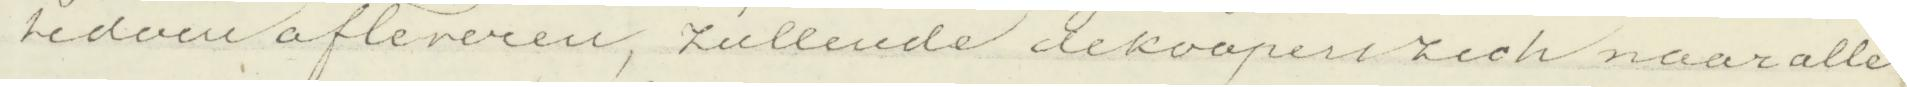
te doen afleveren, zullende dekooperszich naar alle
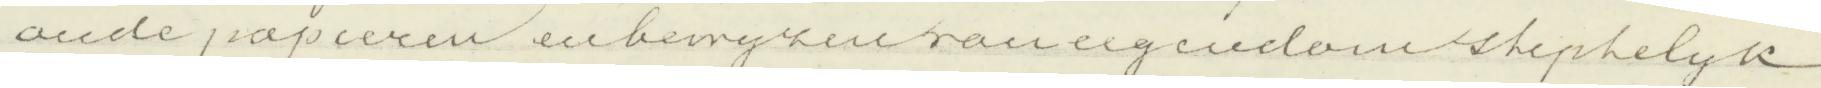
oude papieren enbewyzen van eigendom stiptelyk
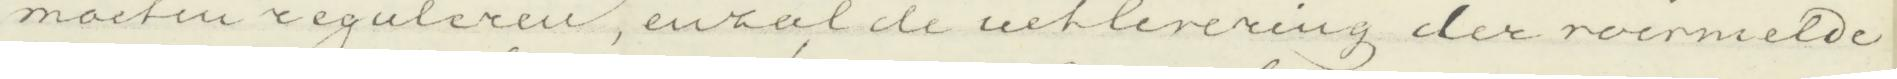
moeten reguleren, enzal de uitlevering der voormelde
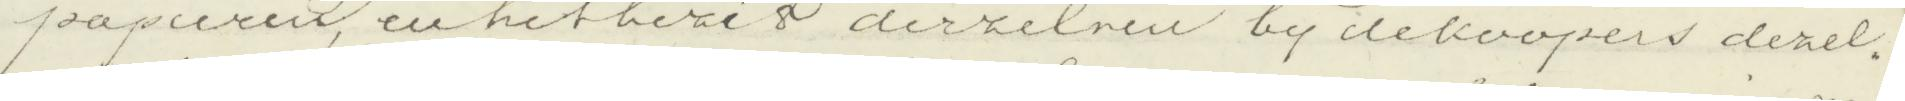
papieren, enhetbezit derzelven by dekoopers dezel„
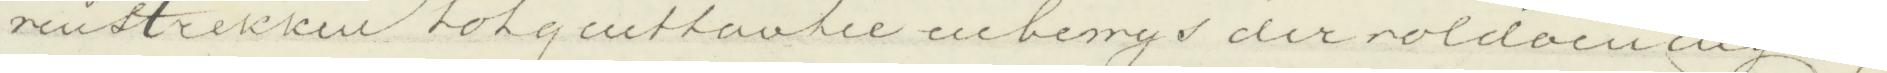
venstrekken totquittantie enbewys der voldoening van
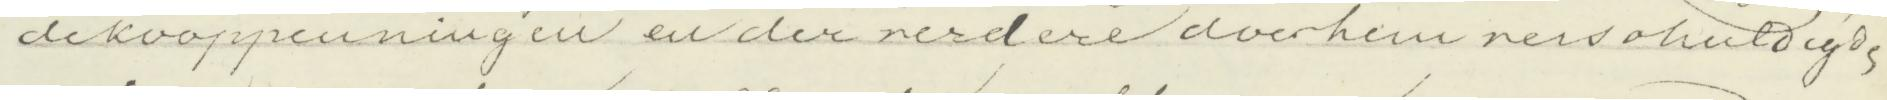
dekooppenningen en der verdere doorhem verschuldigde
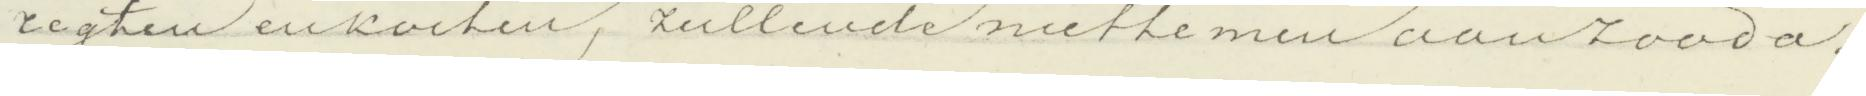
regten enkosten, zullende niette min aanzooda„
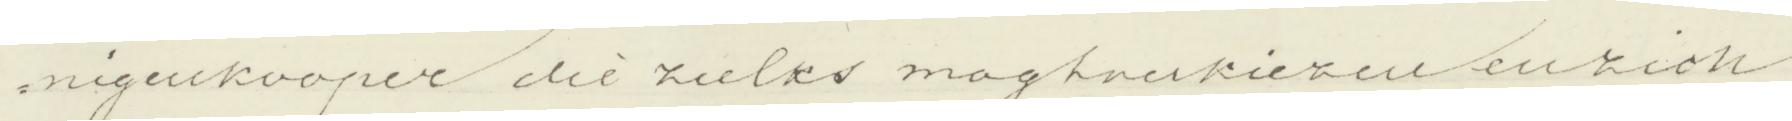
„nigenkooper die zulks mogtverkiezen en zich
